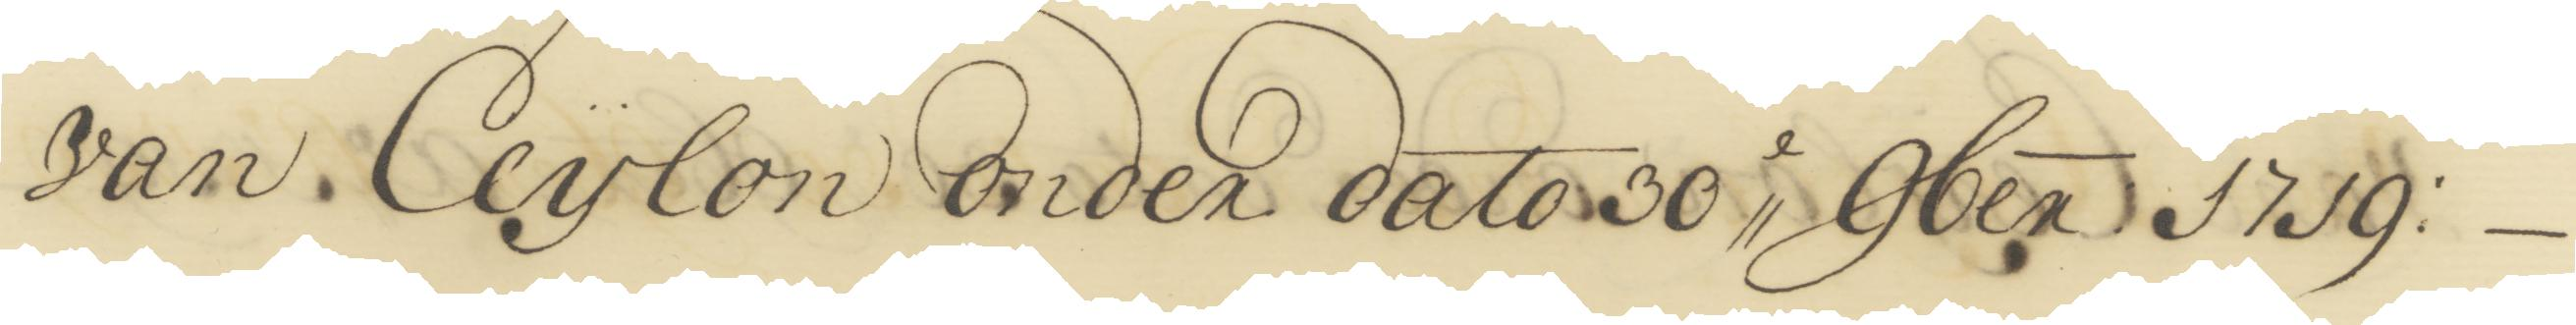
van Ceijlon onder dato 30„e 9ber 1719:—
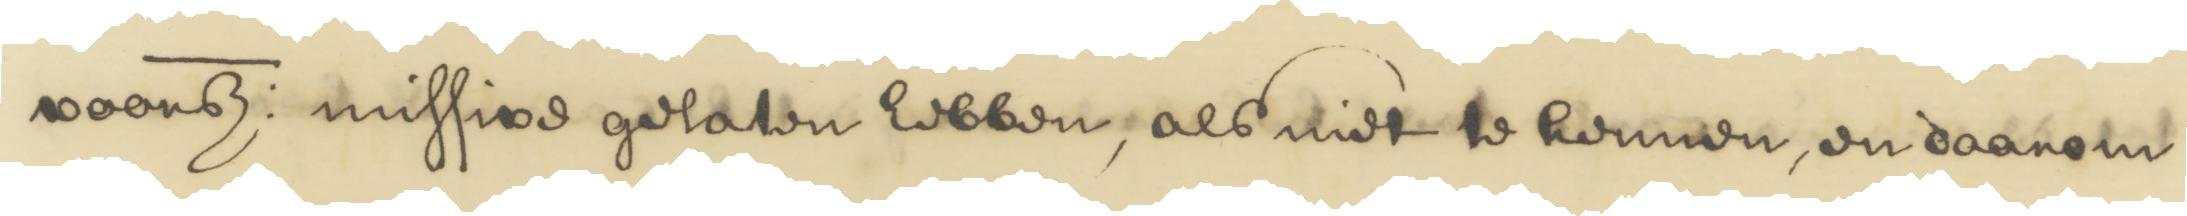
voorsz: missive gelaten hebben, als niet te kennen, en daarom
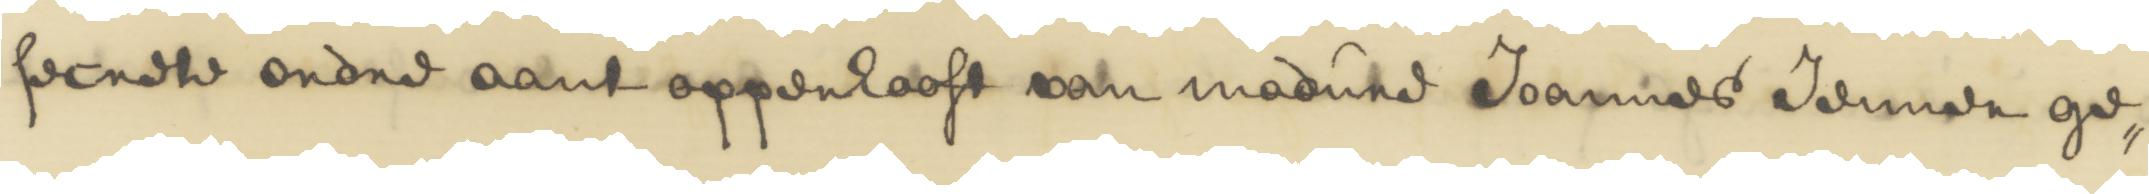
secrete ordre aan 't opperhooft van madure Ioannes Ienner ge„
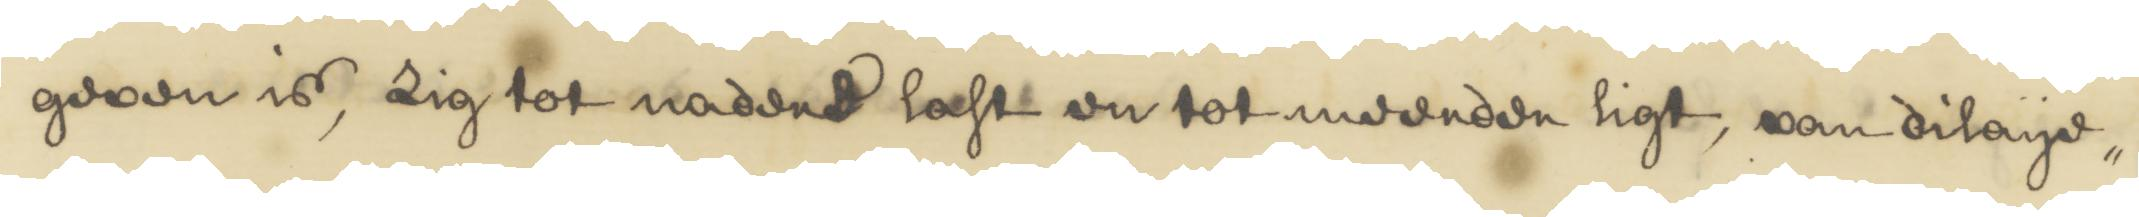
geven is, zig tot nadere last en tot meerder ligt, van dilaije„
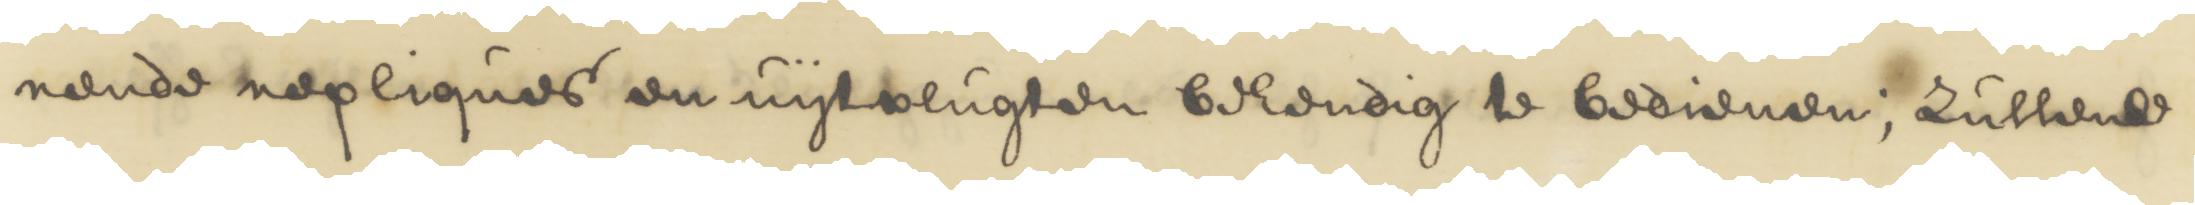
rende repliques en uijtvlugten behendig te bedienen; zullende
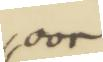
„oor
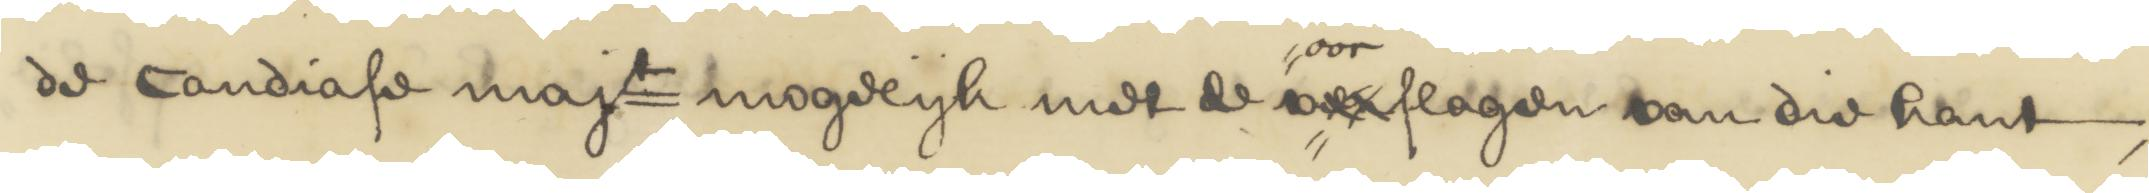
de candiase maj=t mogelijk met de „verslagen van die kant,
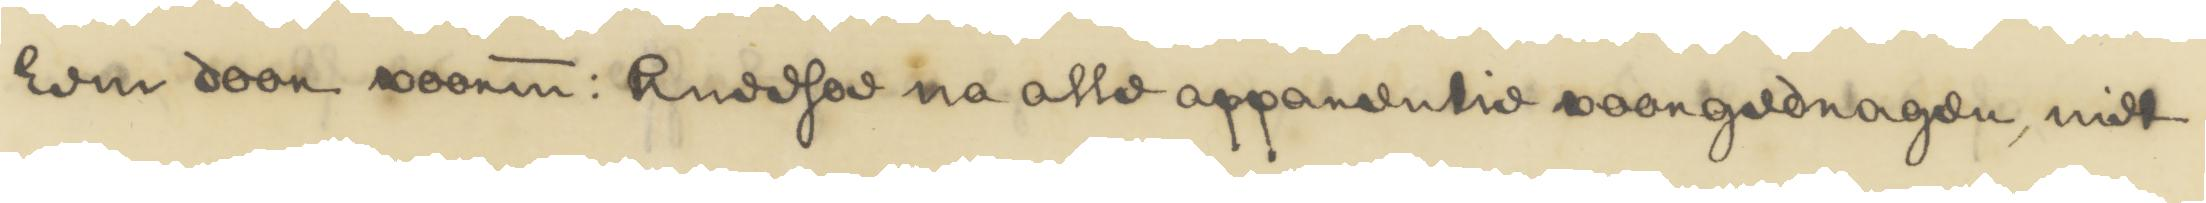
hem door voorm: kneesoe na alle apparentie voorgedragen, niet
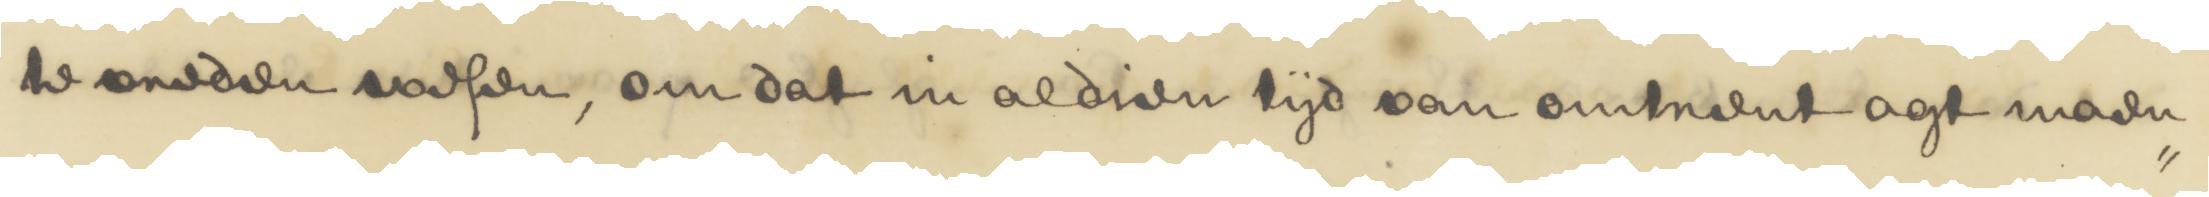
te vreden wesen, om dat in aldien tijd van omtrent agt maen„
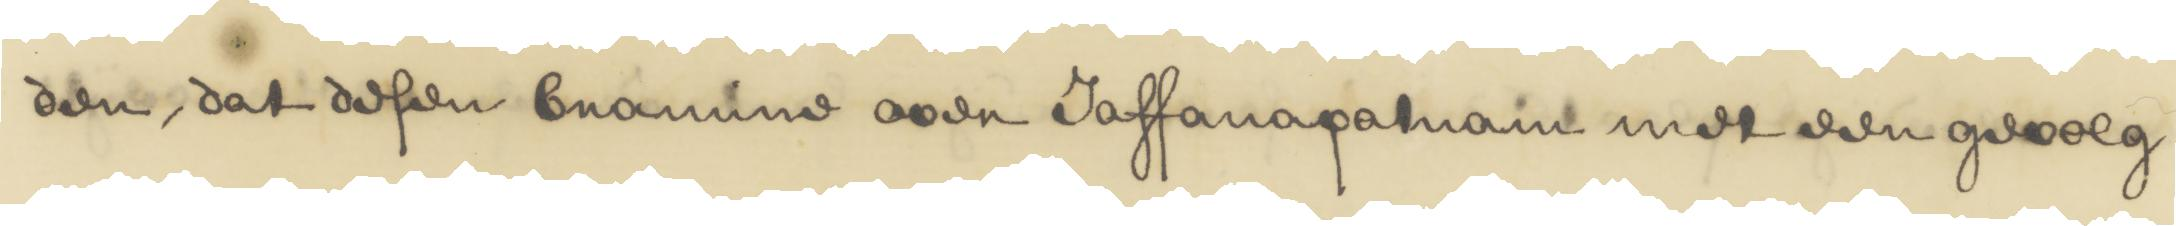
den, dat desen bramine over Jaffanapatnam met een gevolg
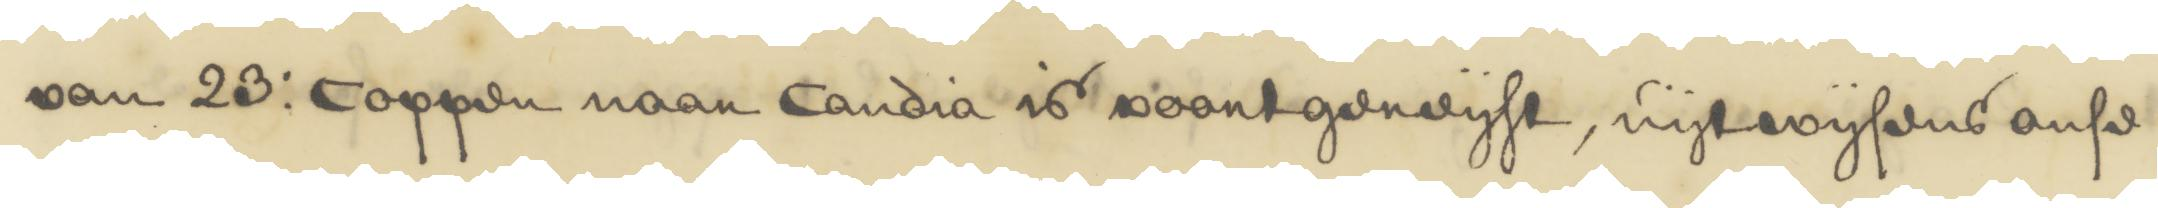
van 23: coppen naar candia is voortgereijst, uijt wijsens onse
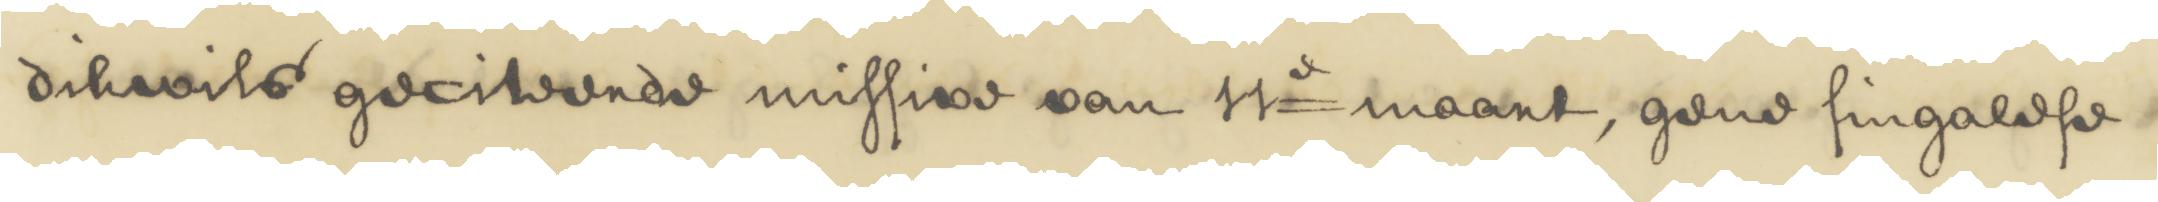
dikwils geciteerde missive van 11=e maart, gene singalese
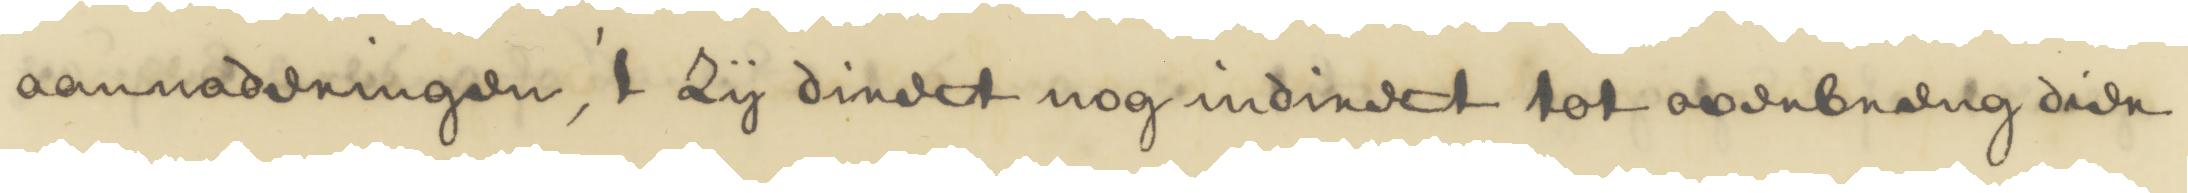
aannaderingen, ’t zij direct nog indirect tot overbreng dier
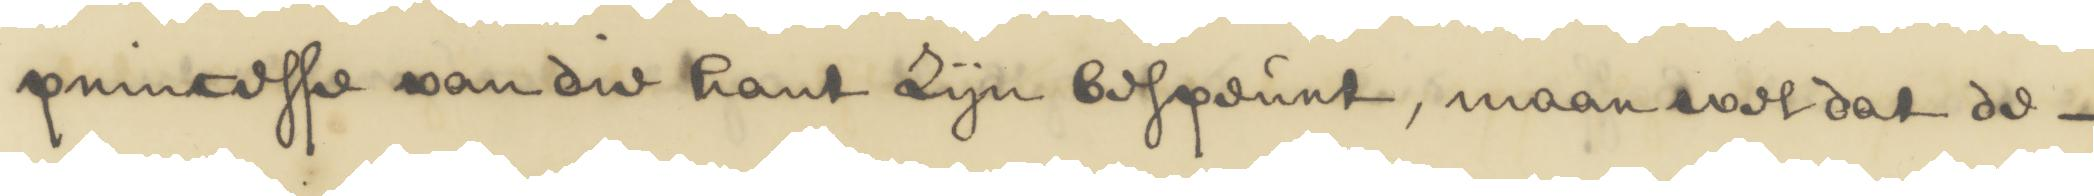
princesse van die kant zijn bespeurt, maar wel dat de —
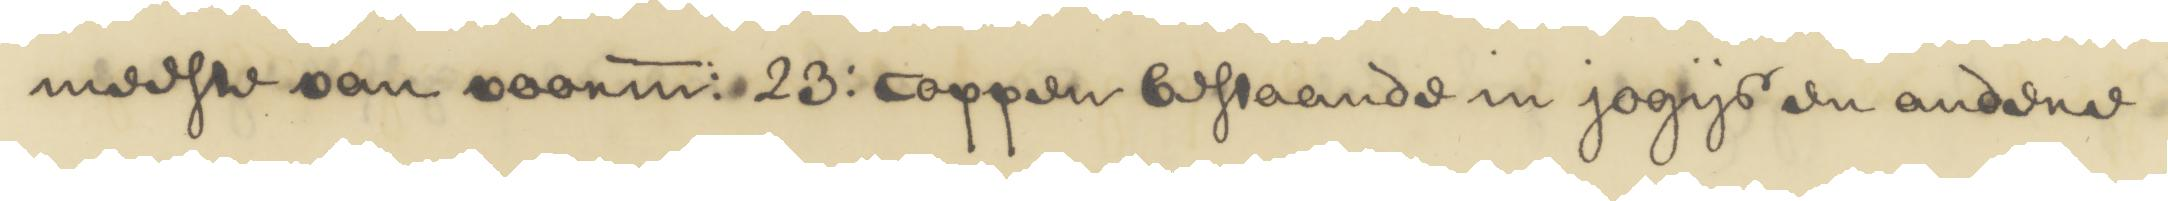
meeste van voorm: 23: coppen bestaande in jogijs en andere
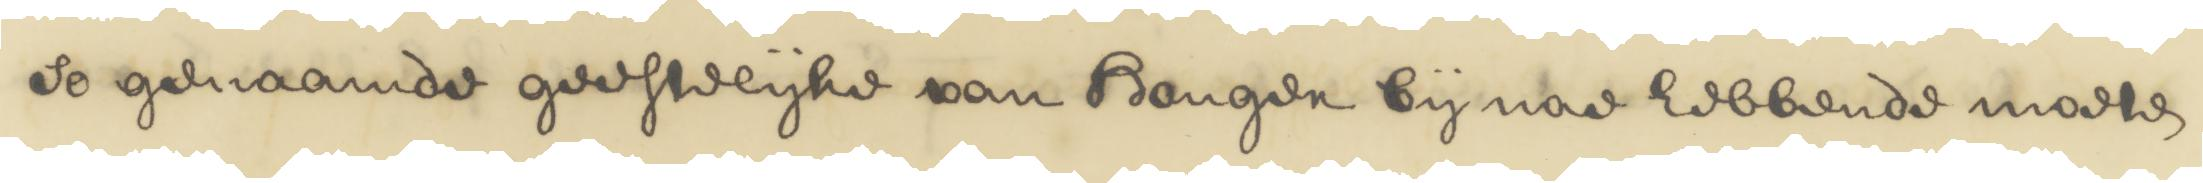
so genaamde geestelijke van Honger bij nae hebbende moeten
